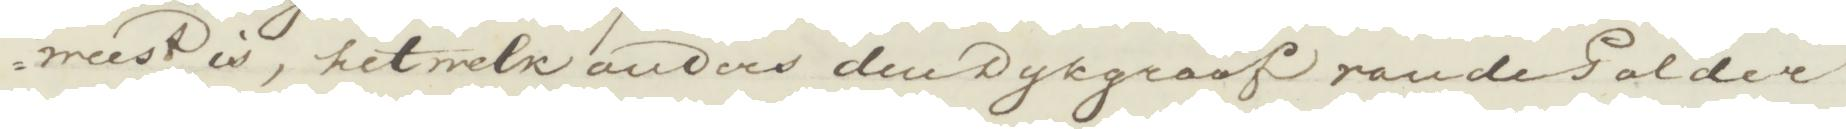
=weest is, het welk anders den Dykgraaf van de Polder
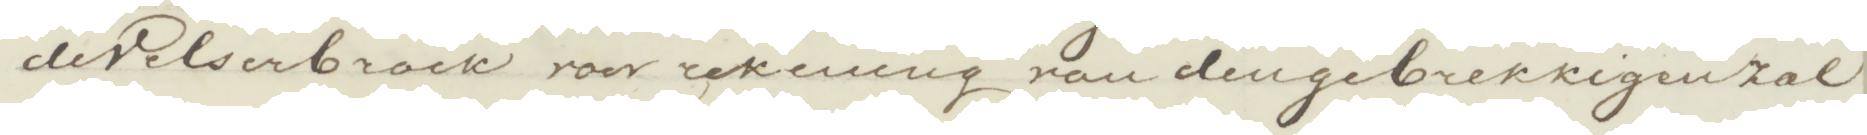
de Velserbroek voor rekening van den gebrekkigen zal
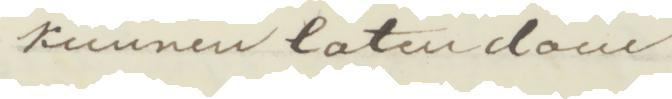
kunnen laten doen
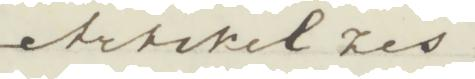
Artikel zes
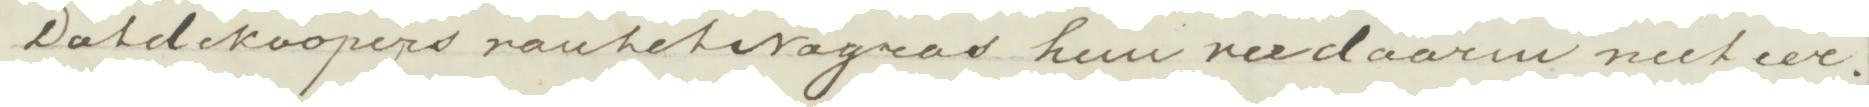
Dat de koopers van het Nagras hun vee daarin niet eer
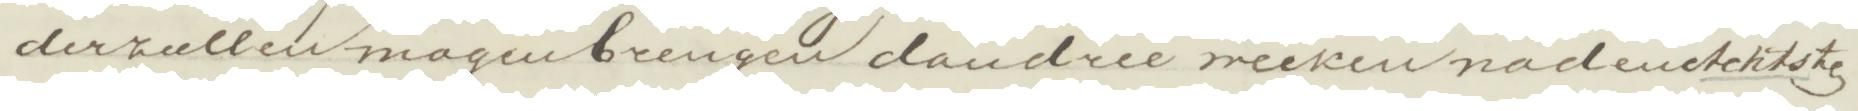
der zullen mogen brengen dan drie weeken na den Achtsten
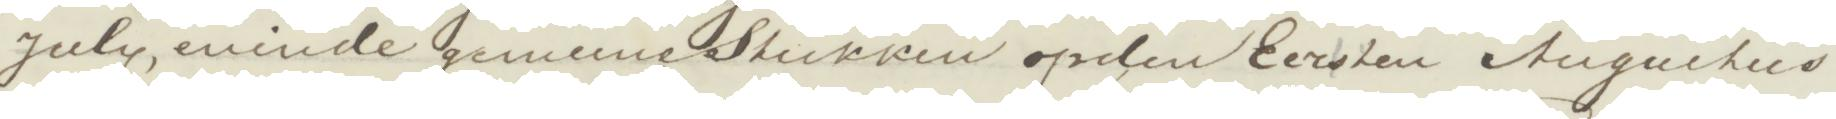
July, en inde gemeene stukken op den Eersten Augustus
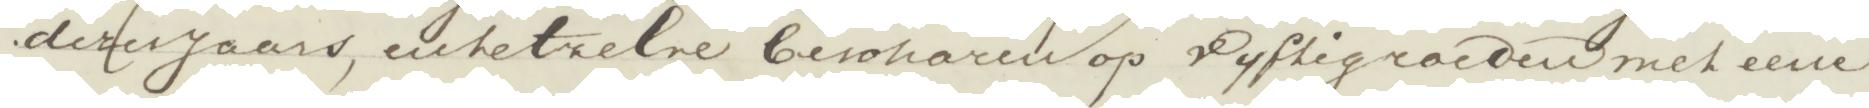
dezes Jaars, en hetzelve beschoren op Vyftig roeden met eene
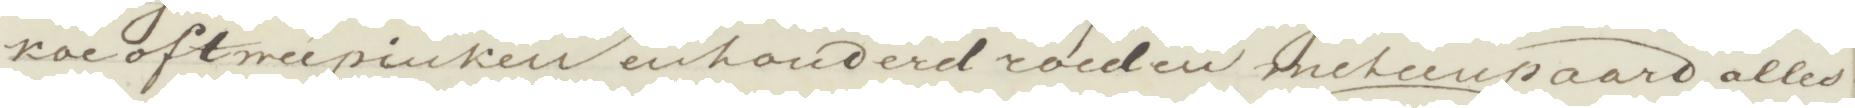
koe of twee pinken en honderd roeden met een paard, alles
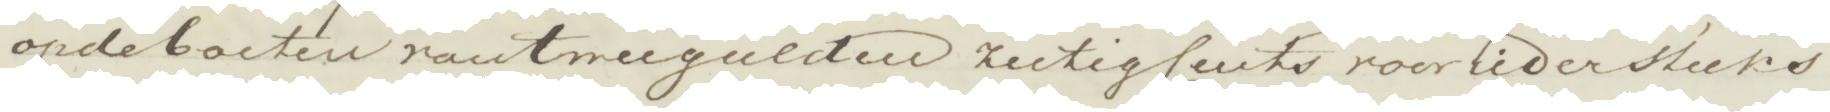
op de boeten van twee gulden zestig Cents voor ieder stuks
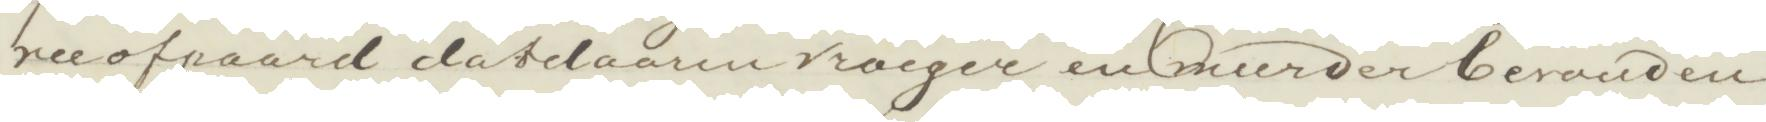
vee of paard dat daarin vroeger en meerder bevonden
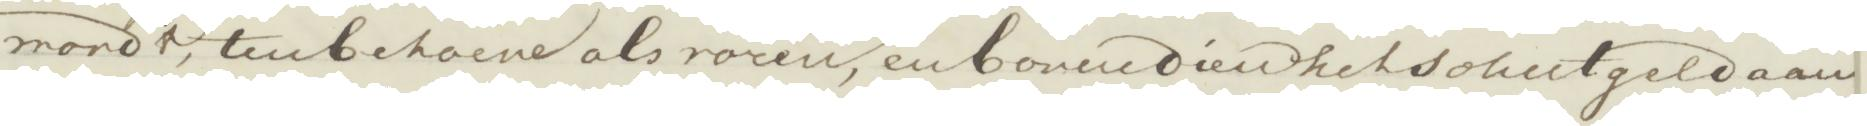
wordt, ten behoeve als voren, en bovendien het schutgeld aan
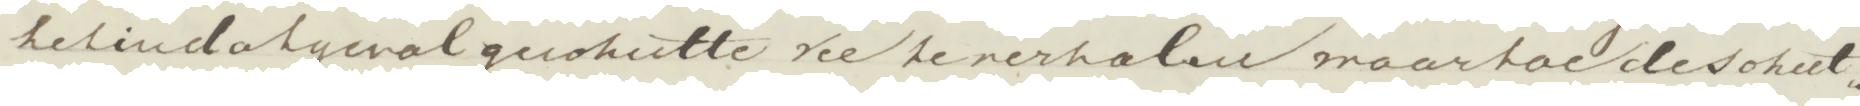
het in datgeval geschutte vee te verhalen waartoe de schut
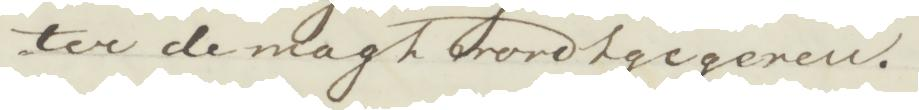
„ter de magt wordt gegeven.
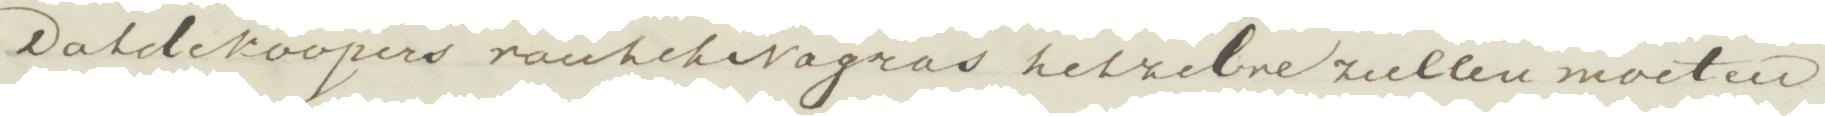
Dat de koopers van het Nagras hetzelve zullen moeten
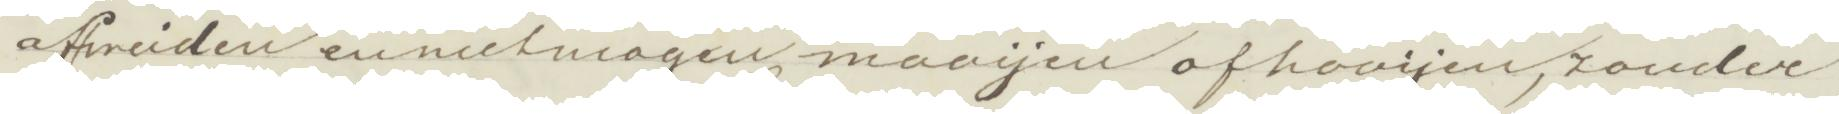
afweiden en niet mogen maaijen of hooijen, zonder
